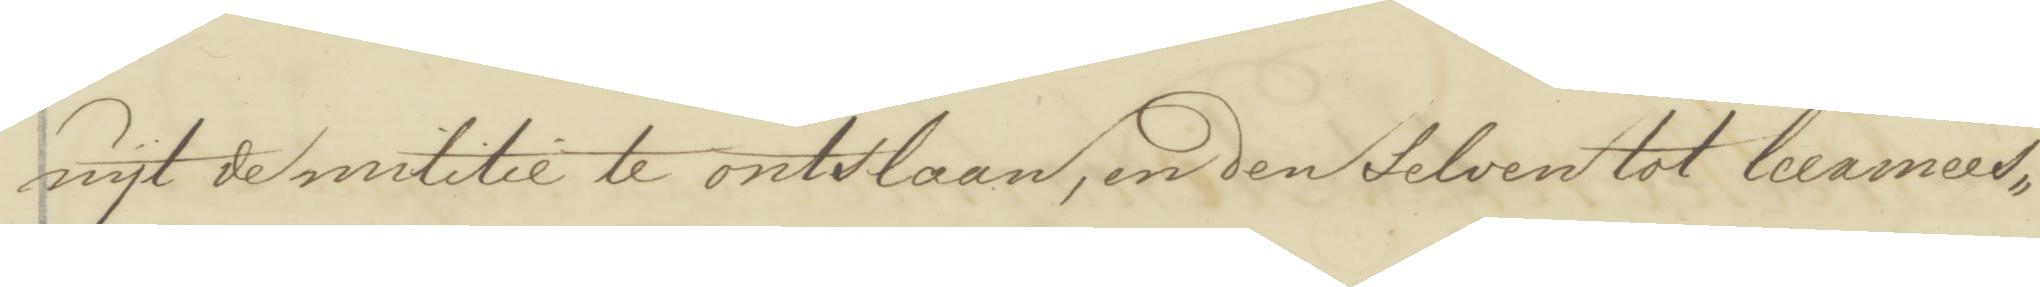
uijt de militie te ontslaan, en den selven tot leermees„
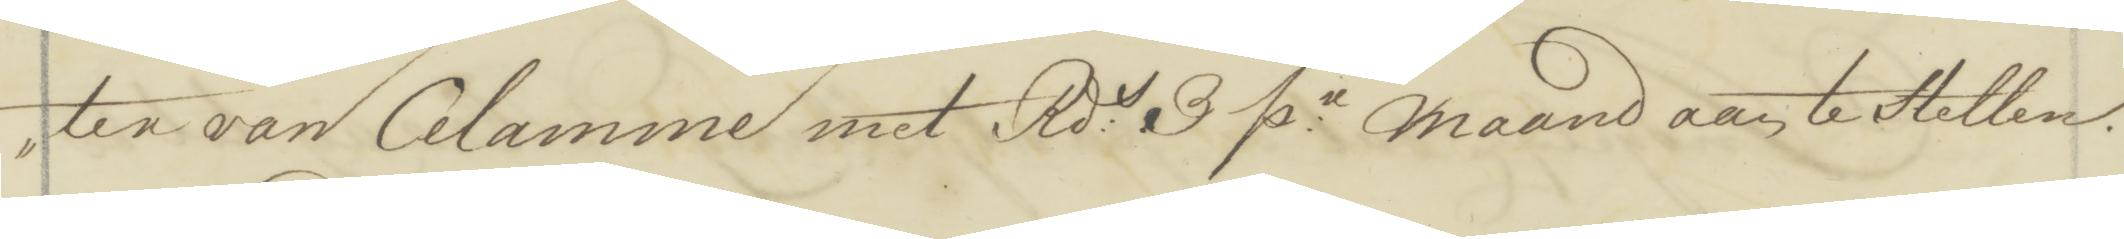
„ter van Celamme met Rd:s 3 p:r maand aan te stellen.
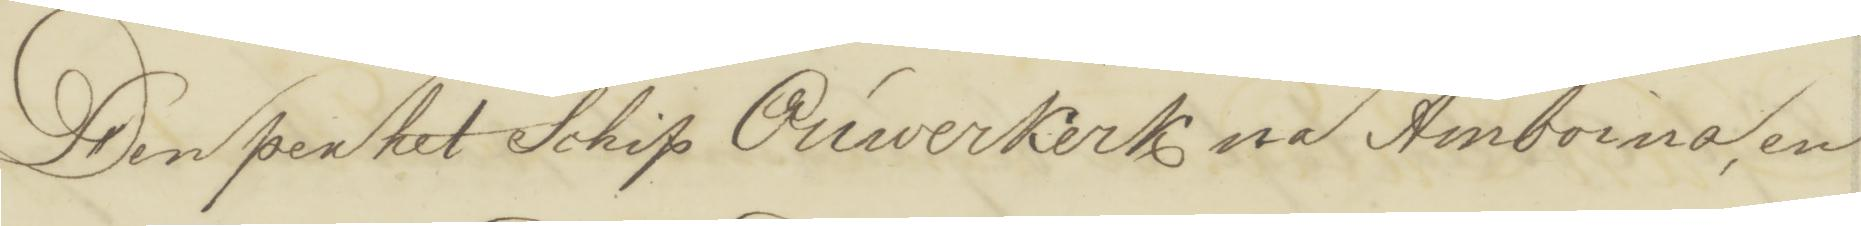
Den per het schip Ouwerkerk na Amboina, en
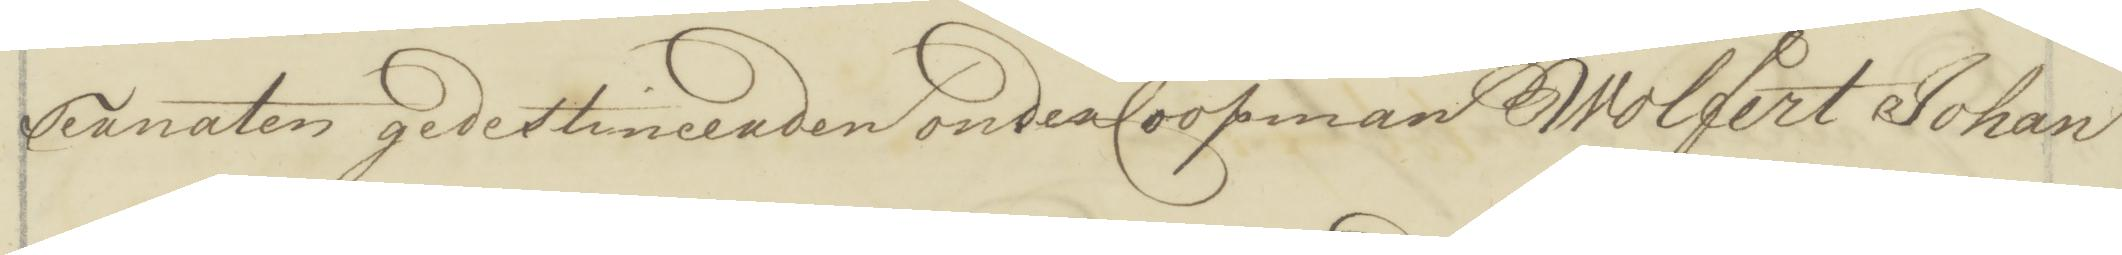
Ternaten gedestineerden onderCoopman Wolfert Iohan
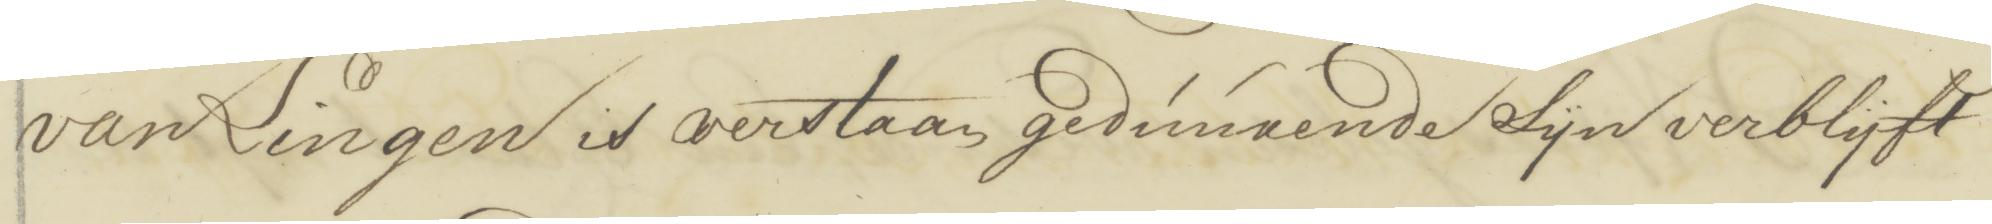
van Lingen is verstaan geduurende sijn verblijft
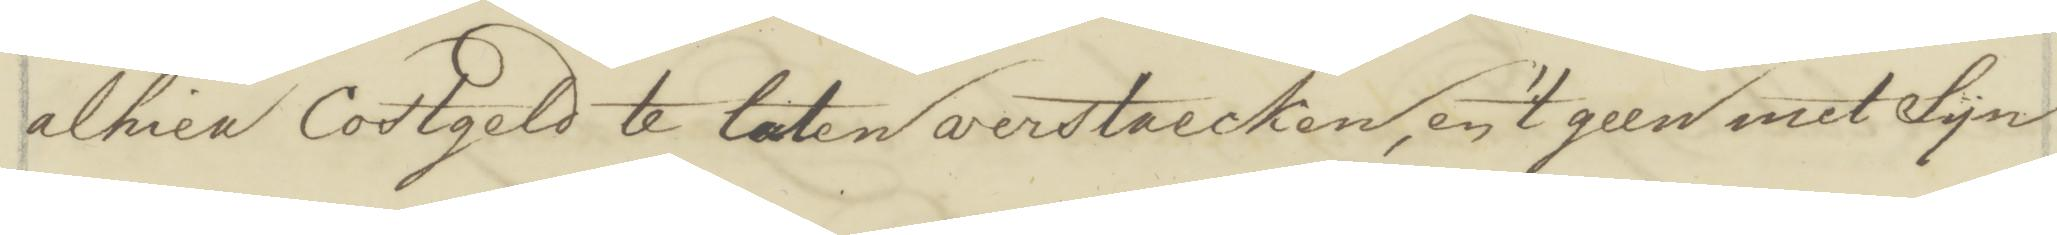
alhier Costgeld te laten verstrecken, en ’t geen met sijn
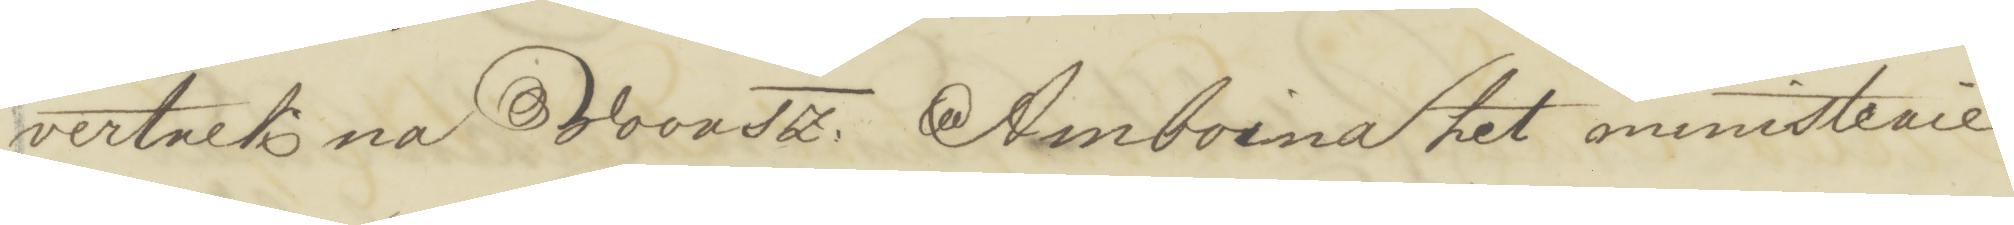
vertrek na Voorsz: Amboina het ministerie
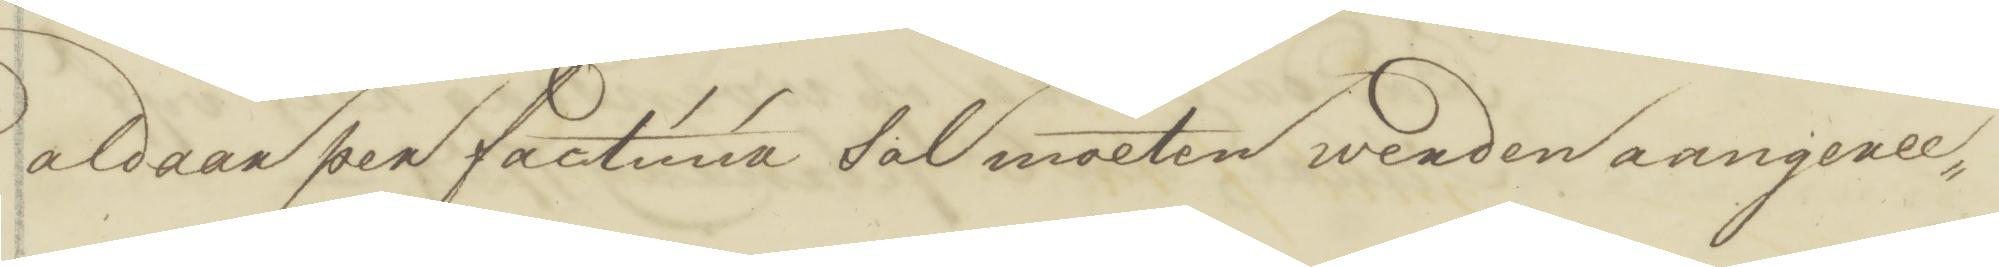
aldaar per factuur sal moeten werden aangeree„
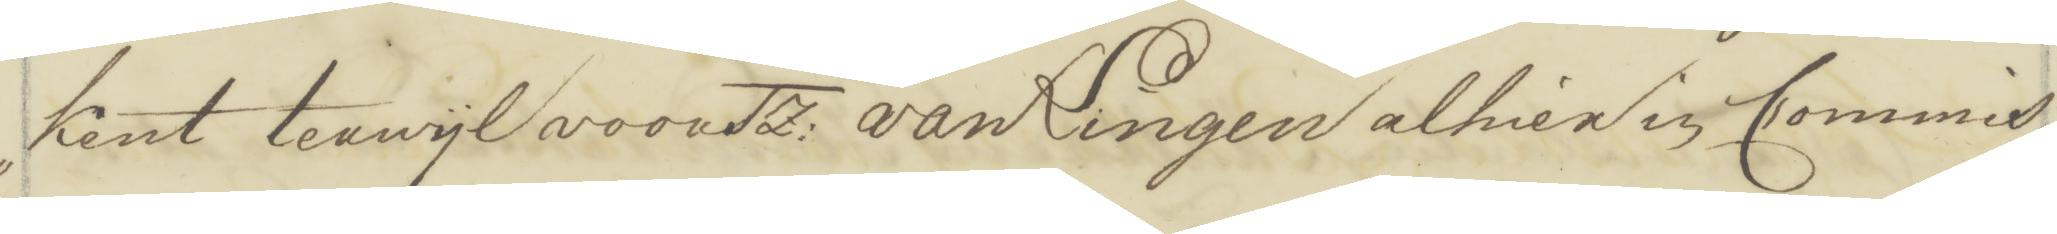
kent terwijl voorsz: van Lingen alhier in Commis
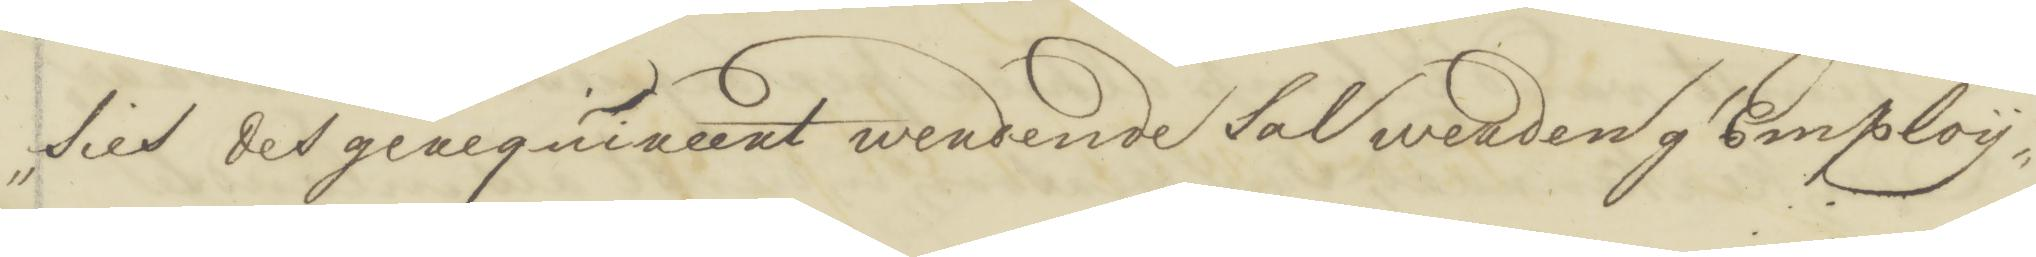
„sies des gerequireert werdende sal werden g’Emploij„
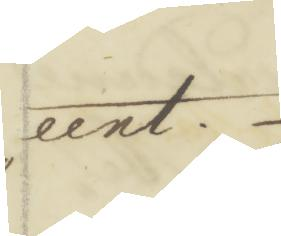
eert.—
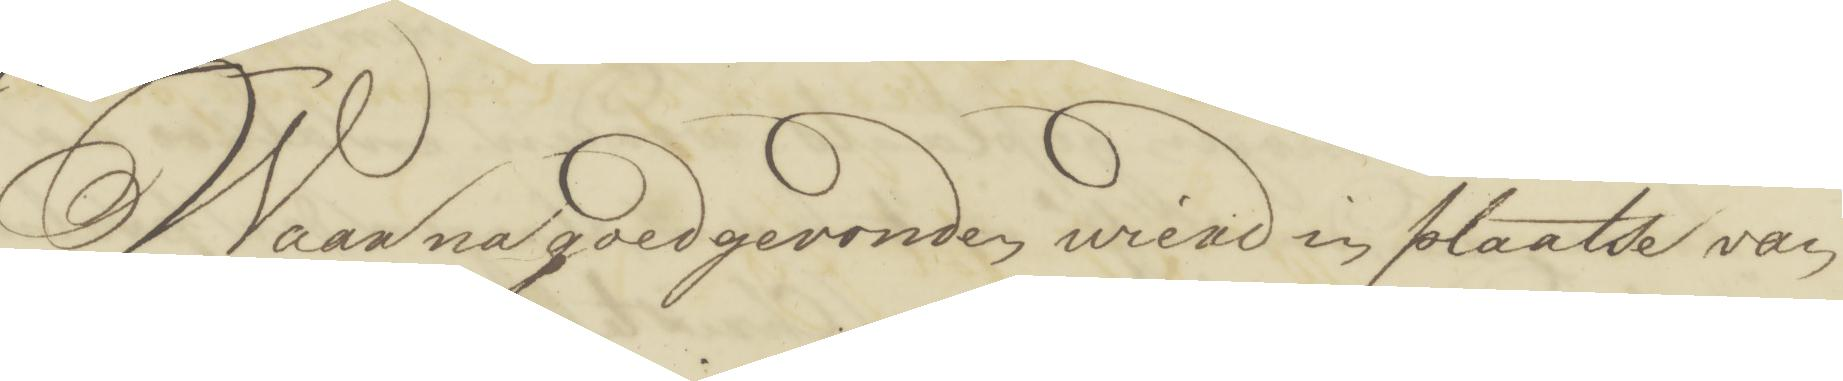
Waar na goed gevonden wierd in plaatse van
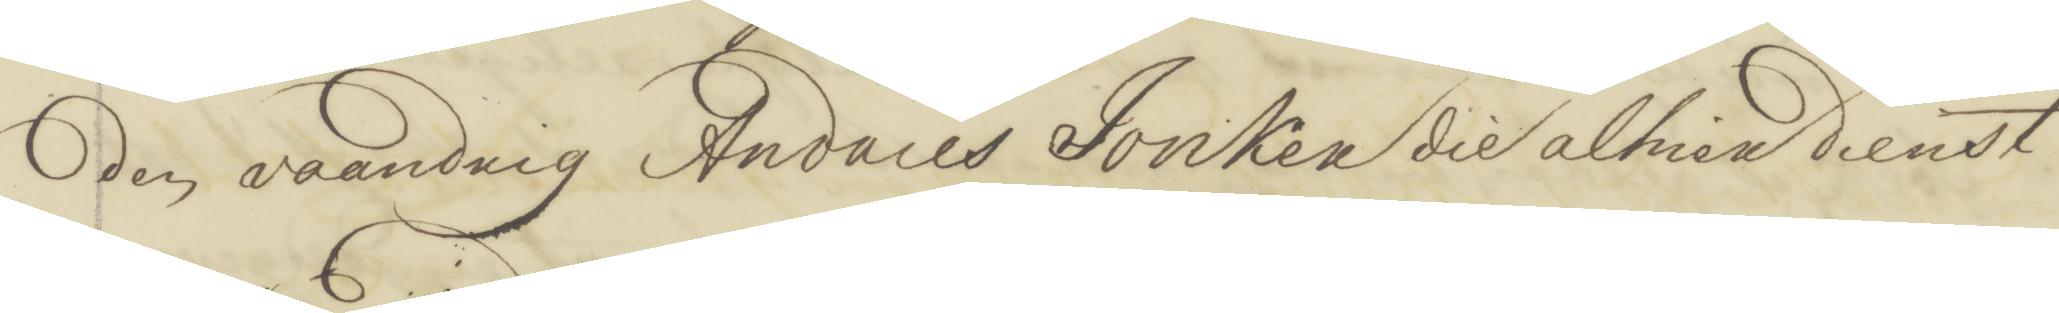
den vaandrig Andries Ionker die alhier dienst
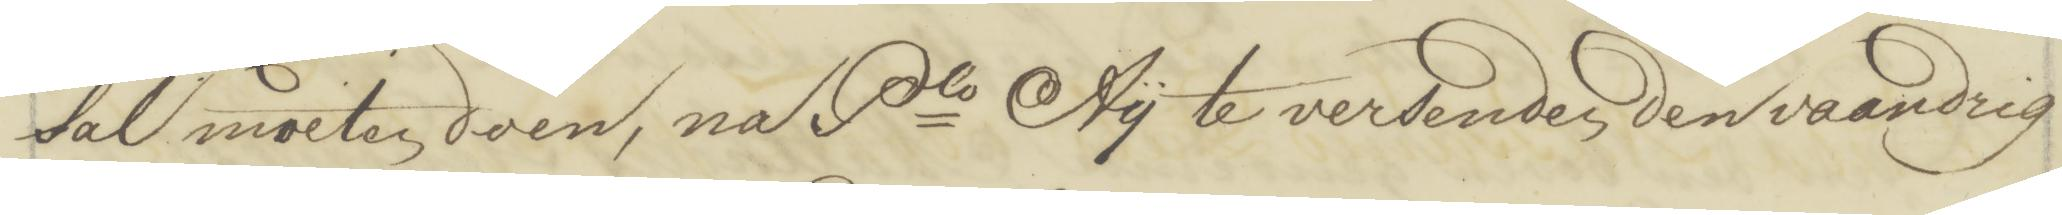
sal moeten doen, na P=lo Aij te versenden den vaandrig
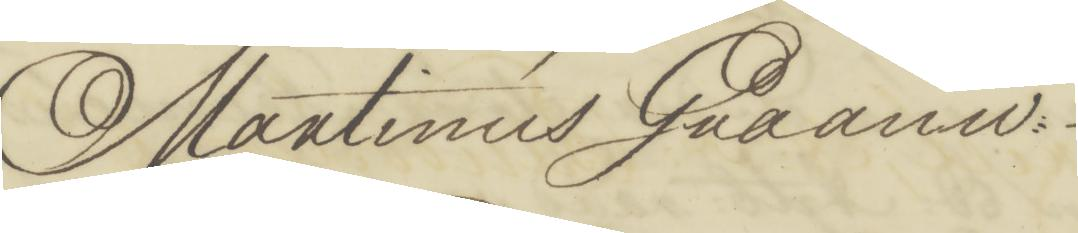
Martinus Graauw:
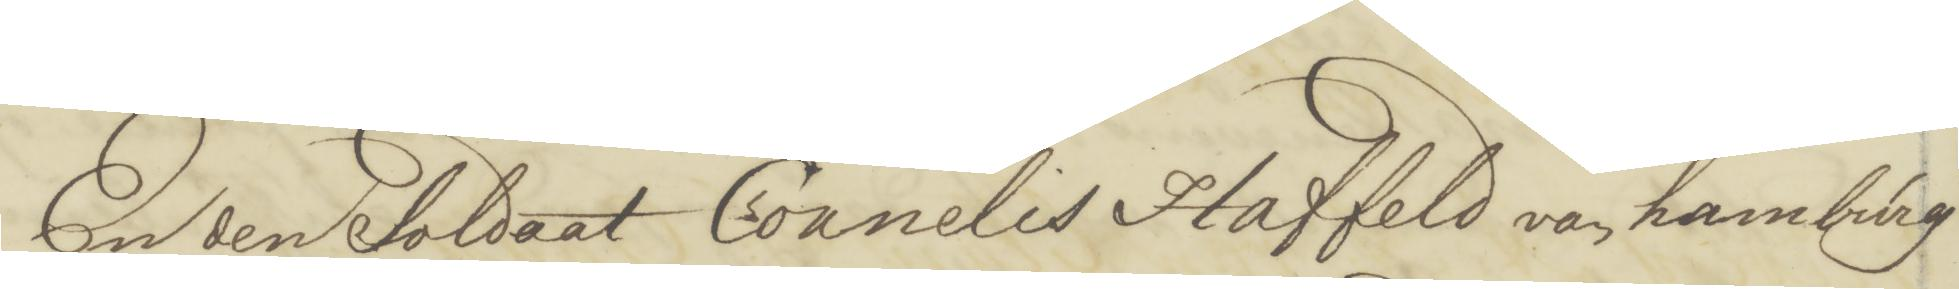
En den soldaat Cornelis Hasseld van hamburg
